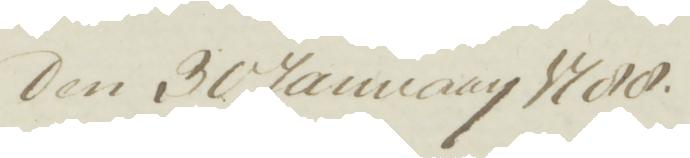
den 30 Januarij 1788. —
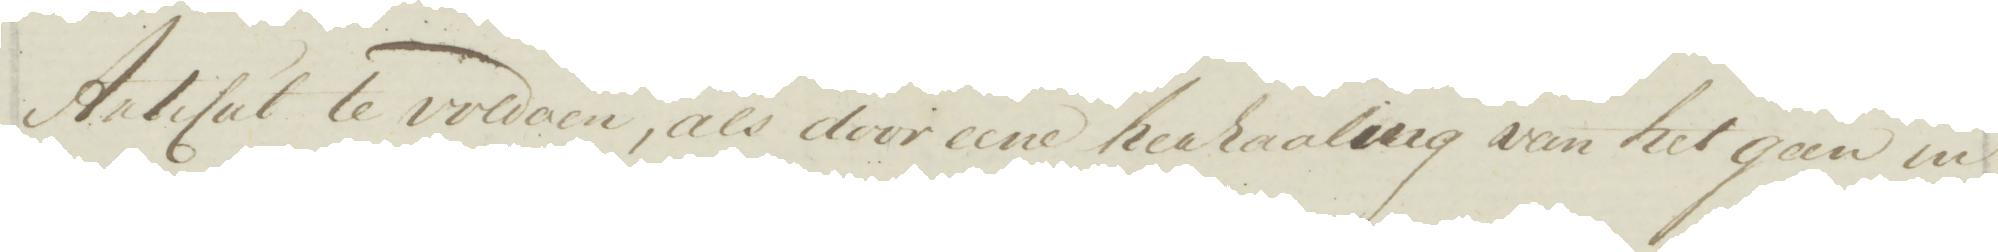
Articul te voldoen, als door eene herhaaling van het geen in
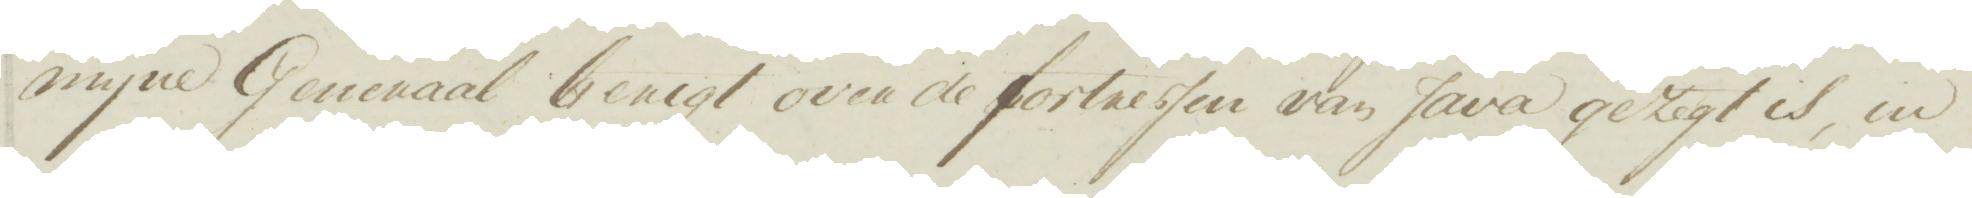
myne Generaal berigt over de fortressen van Java gezegt is, in
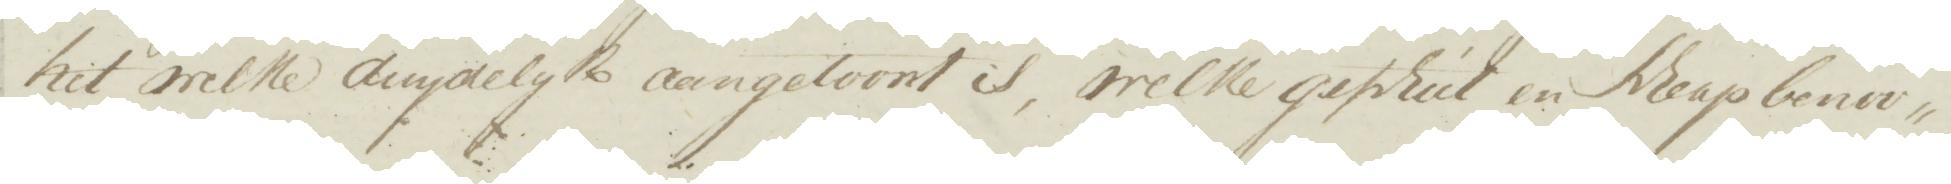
het welke duydelyk aangetoont is, welke geschut en scherp benoo„
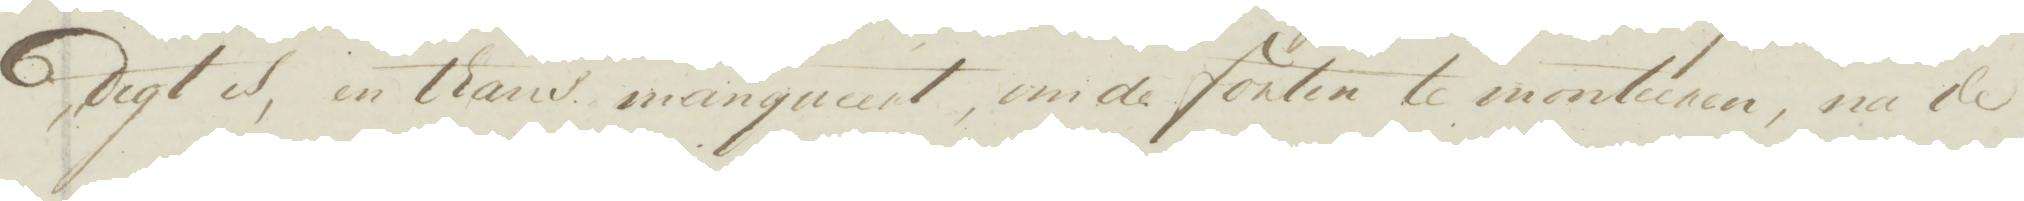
„digt is, en thans manqueert, om de forten te monteeren, na de
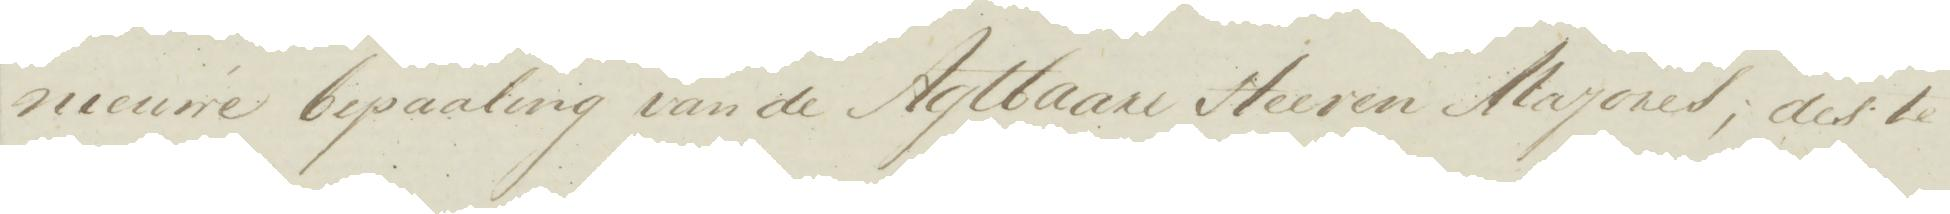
nieuwe bepaaling van de Agtbaare Heeren Majores; des te
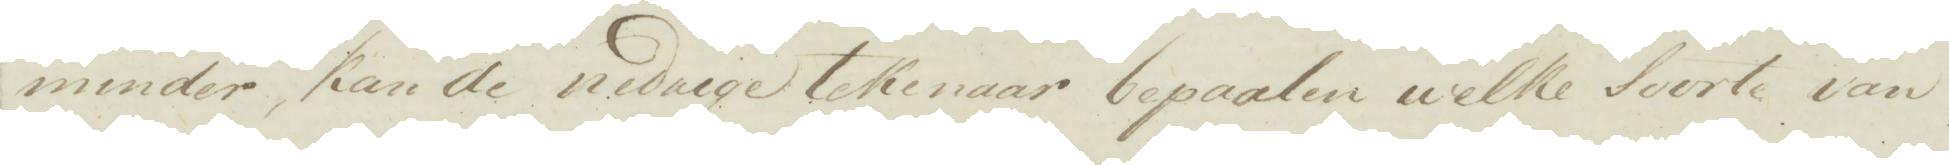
minder, kan de nedrige tekenaar bepaalen welke soorte van
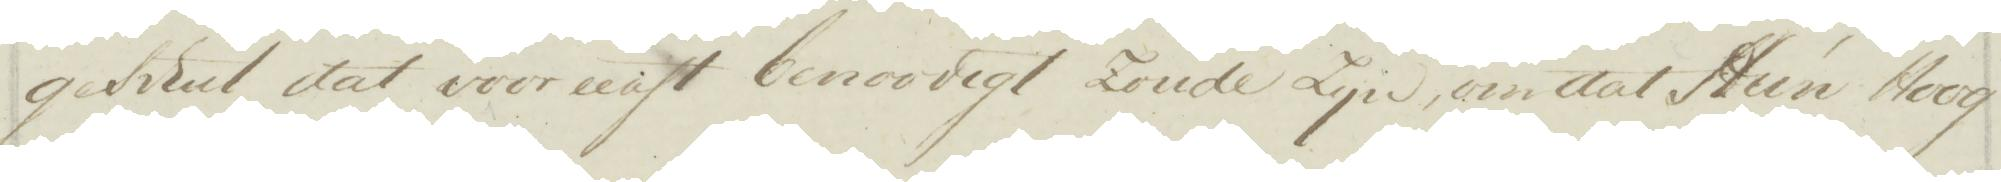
geschut dat voor eerst benoodigt zoude zyn, om dat Hun Hoog
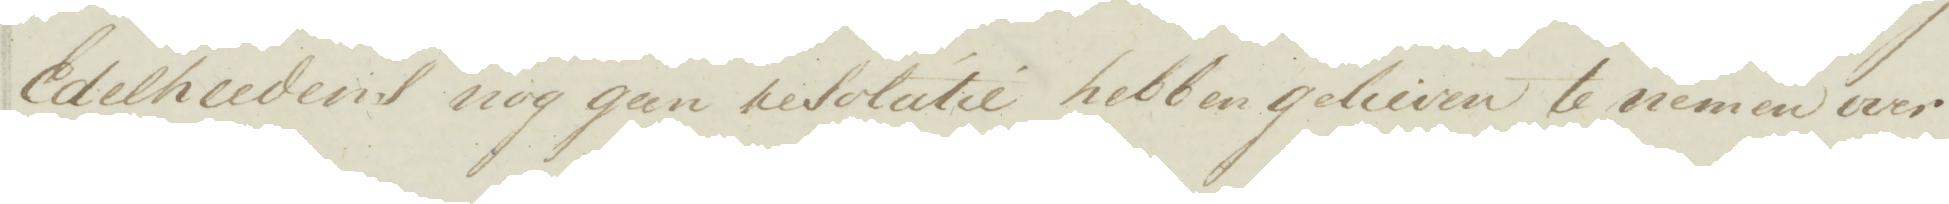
Edelheedens nog geen resolutie hebben gelieven te nemen over
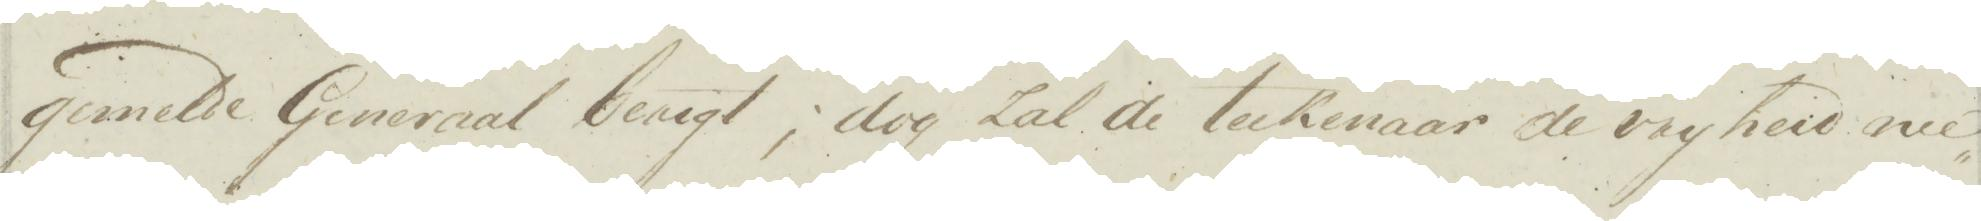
gemelde Generaal berigt; dog zal de teekenaar de vryheid nee„
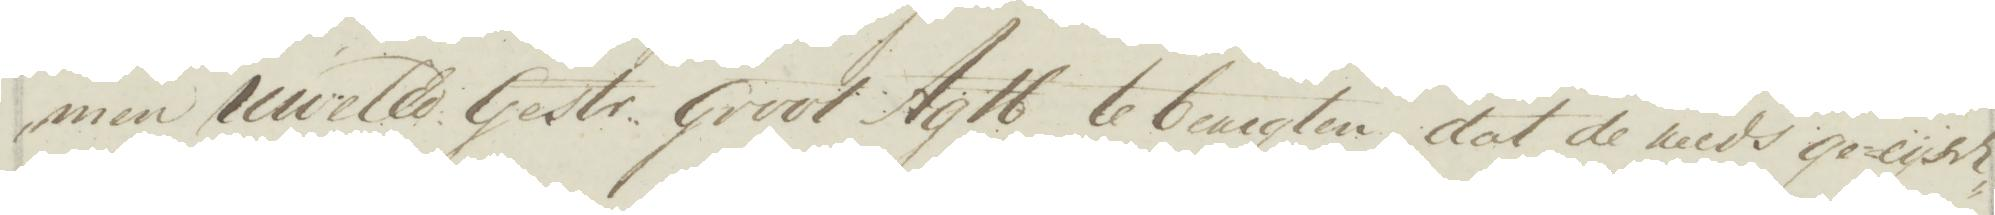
„men uwel Ed: Gestr: Groot Agtb te berigten, dat de reeds ge=eijsch
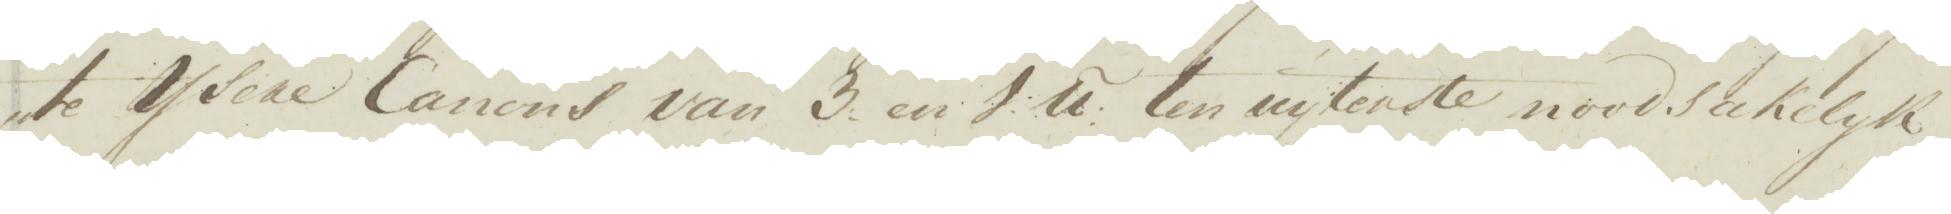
te Ysere Canons van 3: en 1: u: ten uijterste noodsakelyk
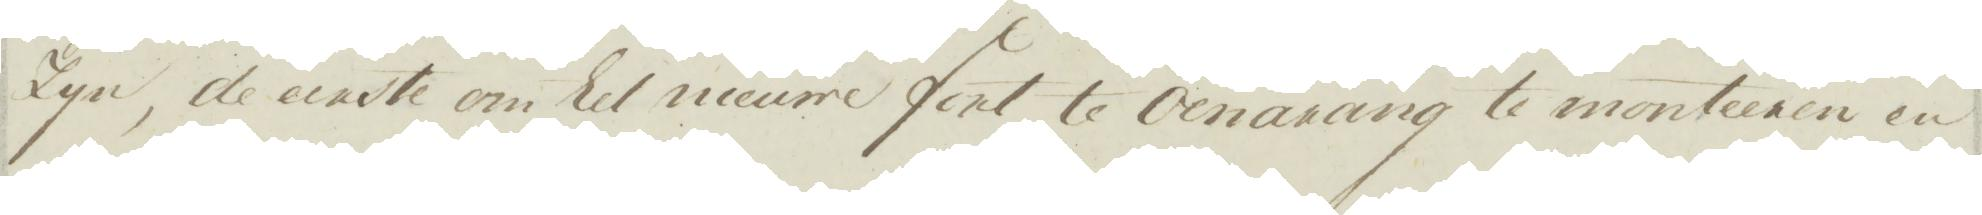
zyn, de eerste om het nieuwe fort te Oenarang te monteeren en
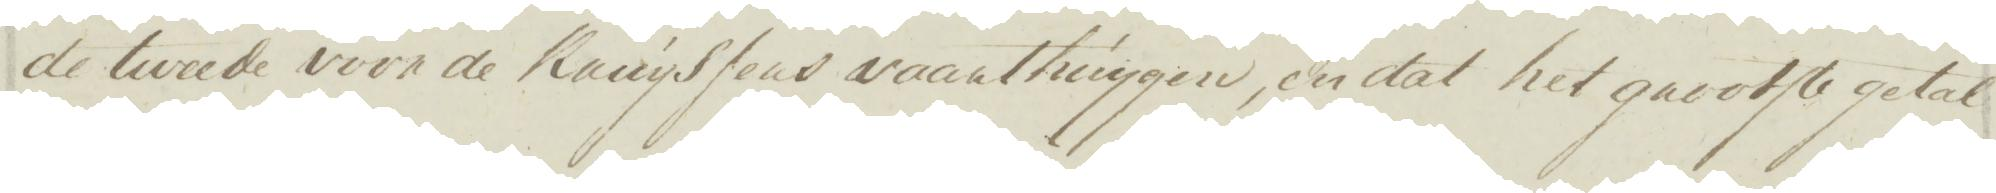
de tweede voor de Kruijssers vaarthuijgen, en dat het grootste getal
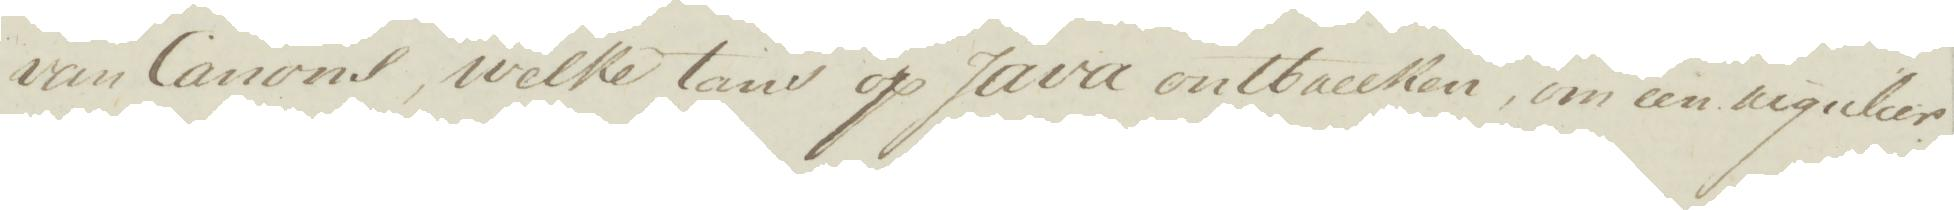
van Canons, welke tans op Java ontbreeken, om een regulier
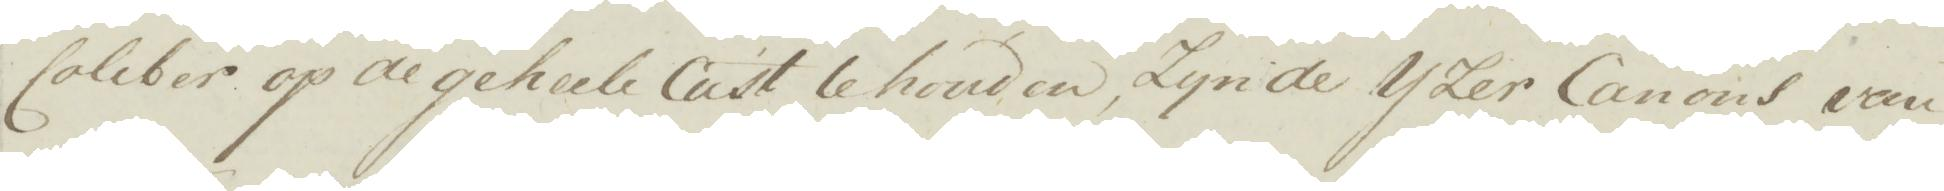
Coliber op de geheele Cust te houden, zynde Yzer Canons van
